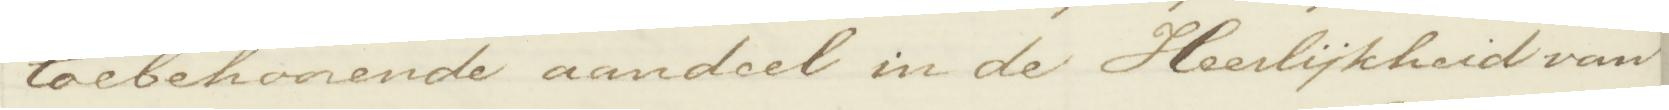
toebehoorende aandeel in de Heerlijkheid van
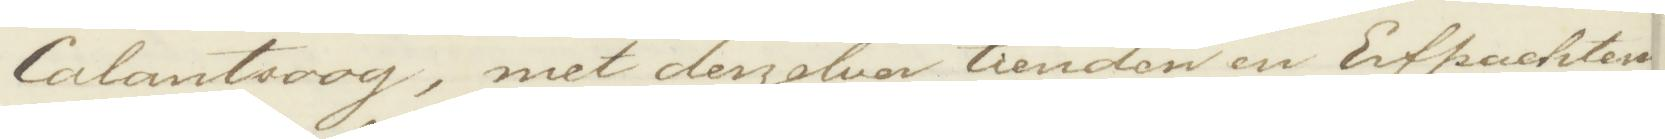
Calantsoog, met deszelver tienden en Erfpachten,
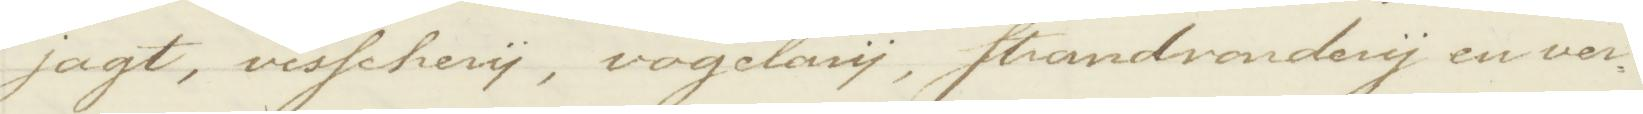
jagt, visscherij, vogelarij, strandvonderij en ver„
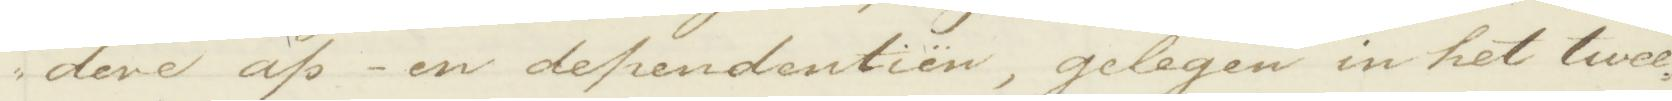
„dere ap -en dependentiën, gelegen in het twee
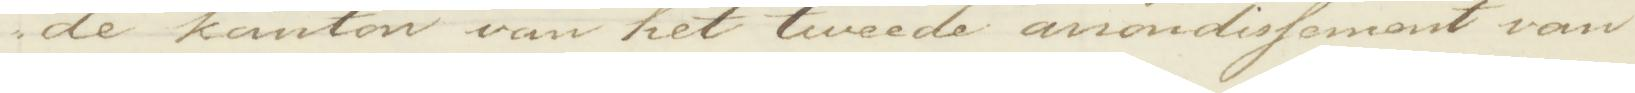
„de kanton van het tweede arrondissement van
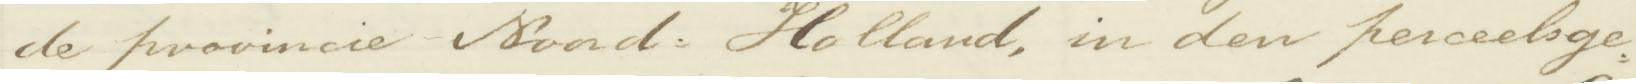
de provincie Noord: Holland, in den perceelsge
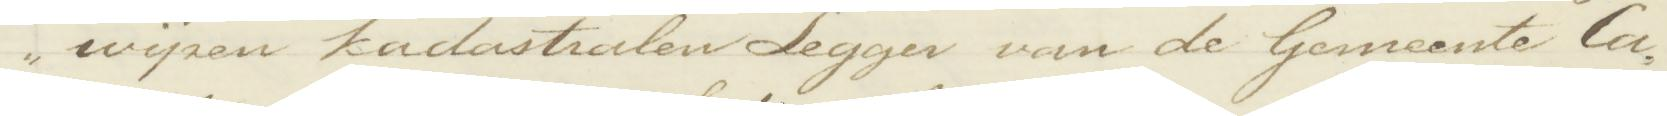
„ wijzen kadastralen Legger van de Gemeente Ca„
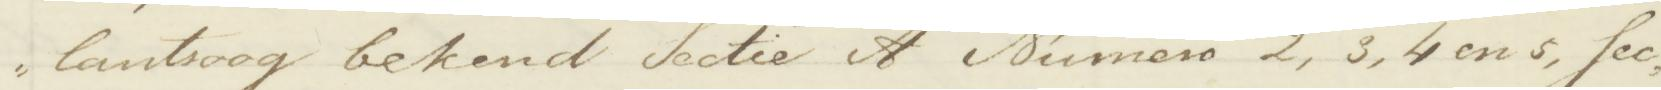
„ lantsoog bekend sectie A Numero 2, 3, 4 en 5, sec
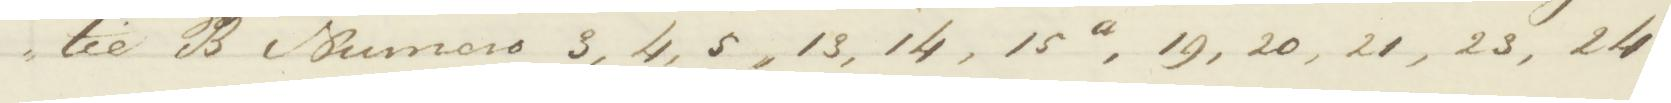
„ tie B Numero 3, 4, 5 „ 13, 14, 15 a, 19, 20, 21, 23, 24
